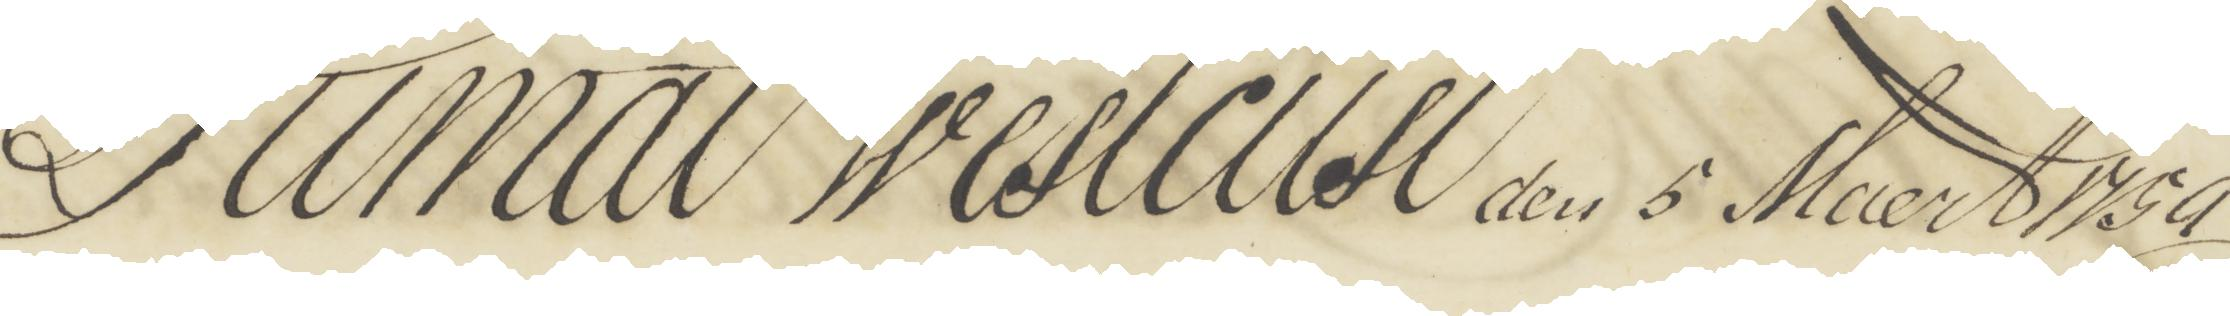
Van Sumats Westcust den 5 Maert 1754
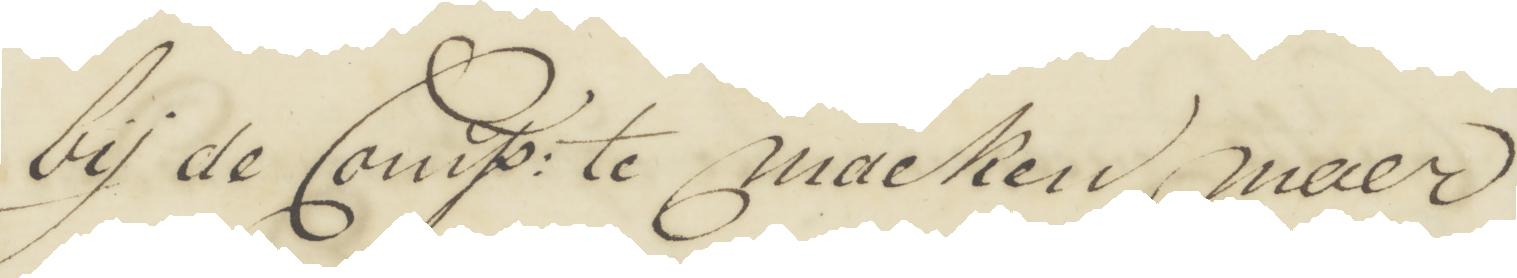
bij de Comp: te maeken, maer
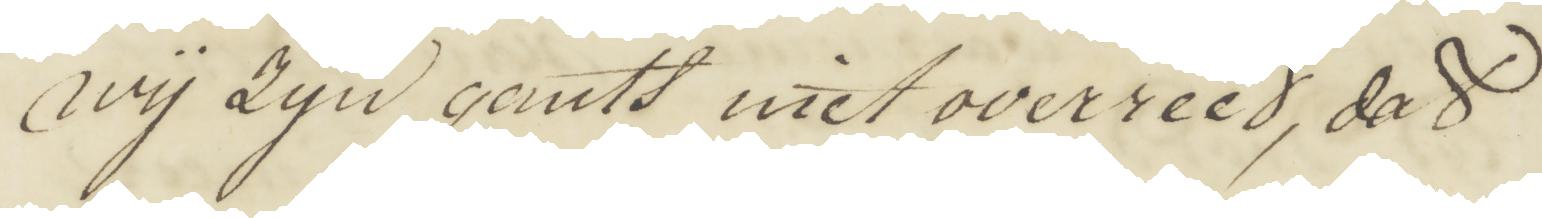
wij zijn gants niet overreed, dat
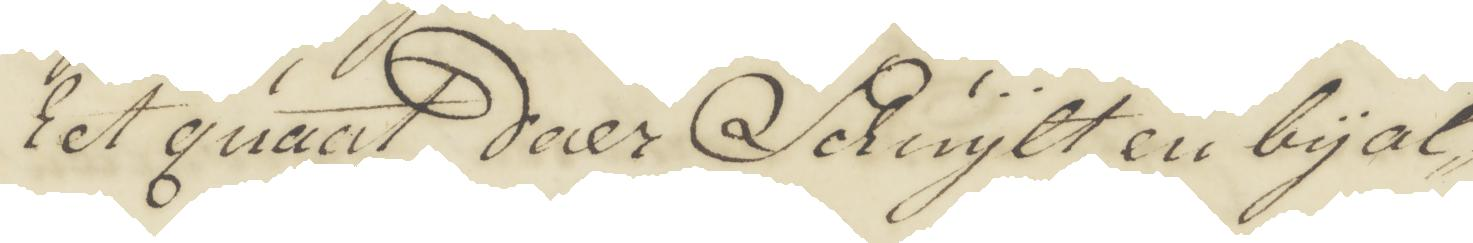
het quaat daer schuijlt en bij al„
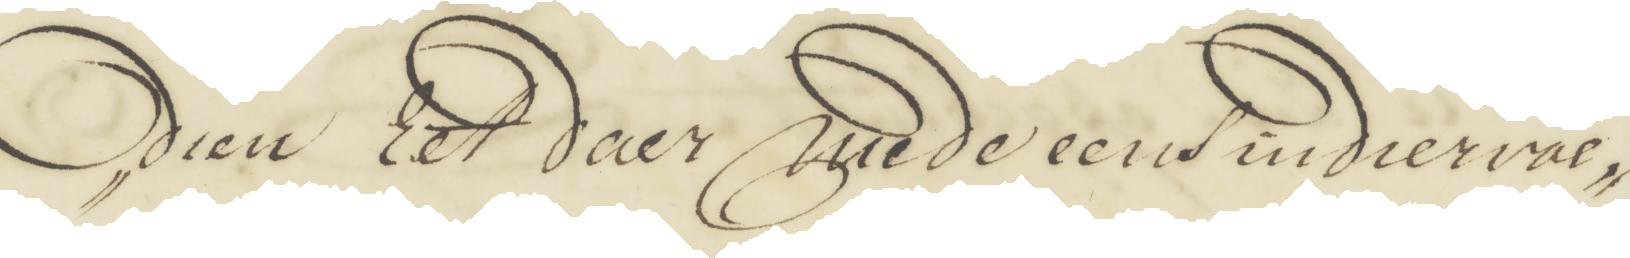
„dien het daer mede eens in diervoe„
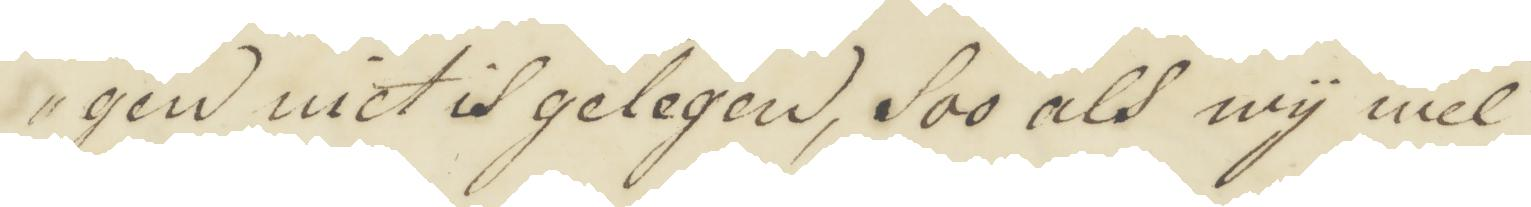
„gen niet is gelegen, soo als wij wel
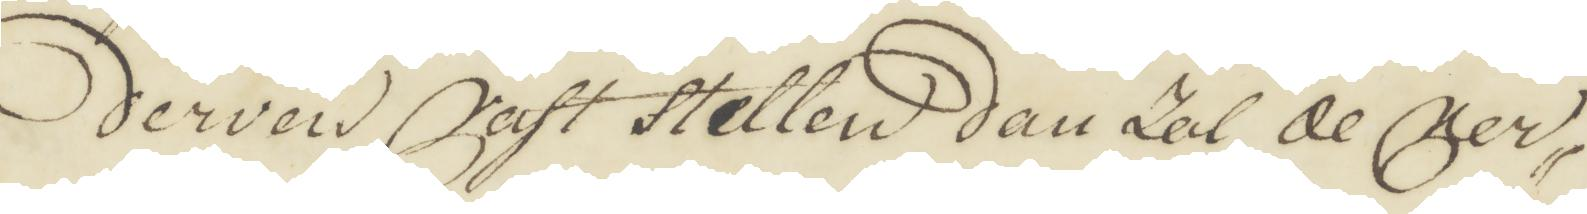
derven vast stellen dan zal de ver„
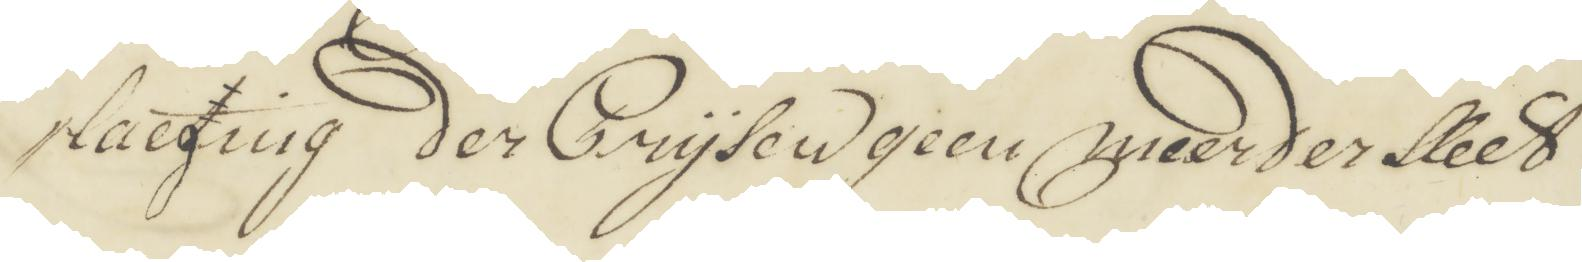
laeging der Prijsen geen meerder sleet
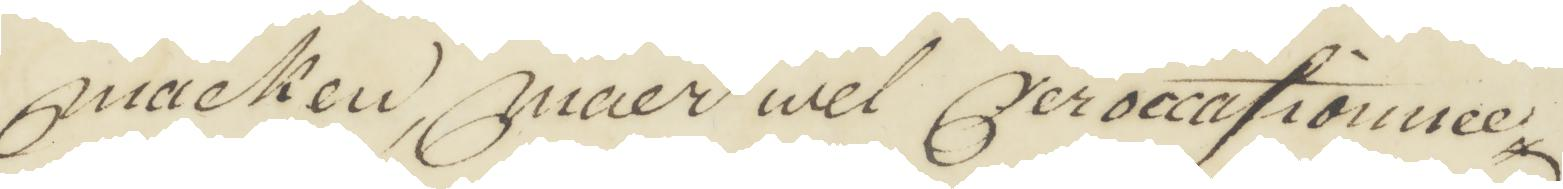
maeken, maer wel veroccasionnee„
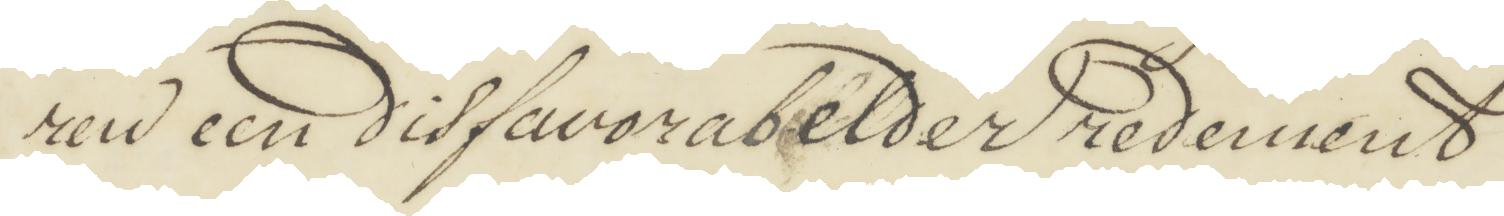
ren een disfavorabelder redement
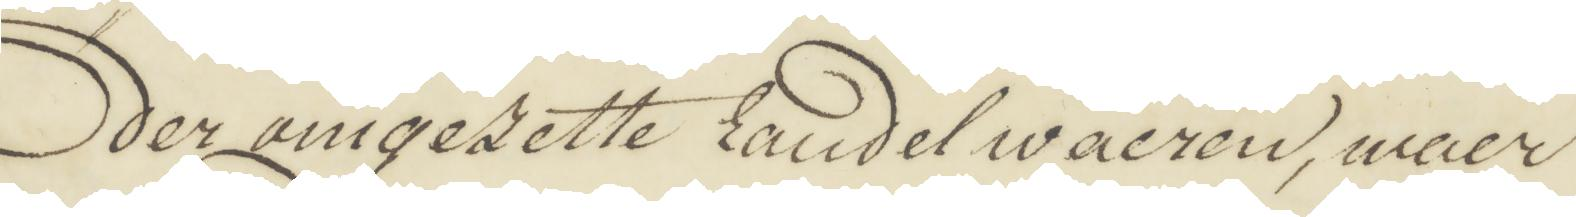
der omgezette handelwaeren, waer
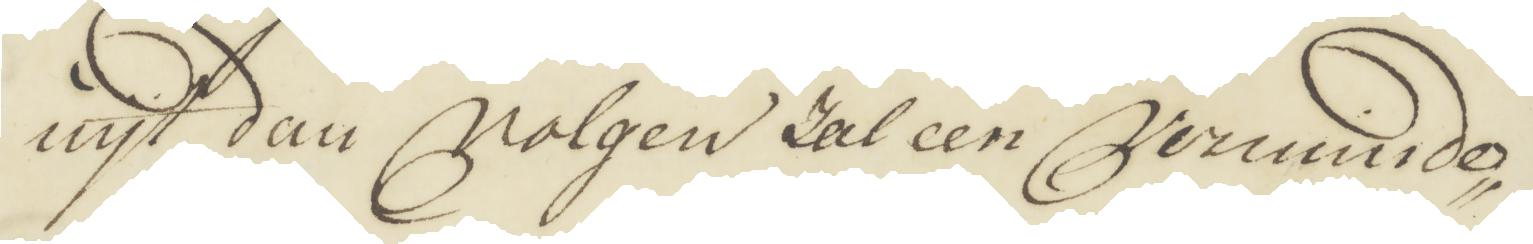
uijt dan volgen zal een verminde„
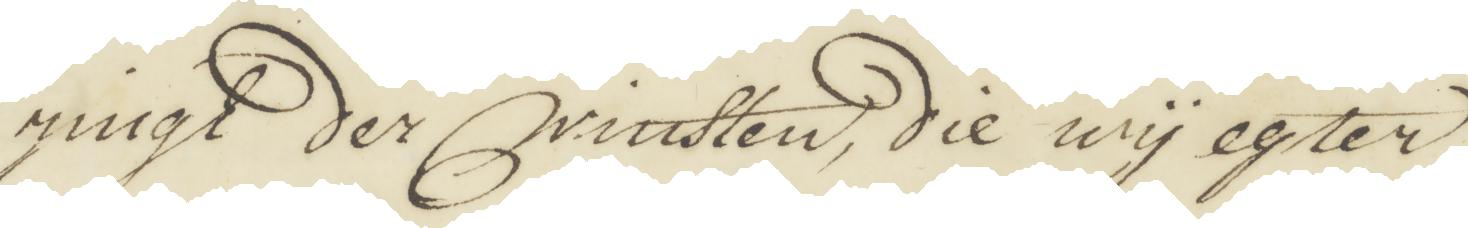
ringh der winsten, die wij egter
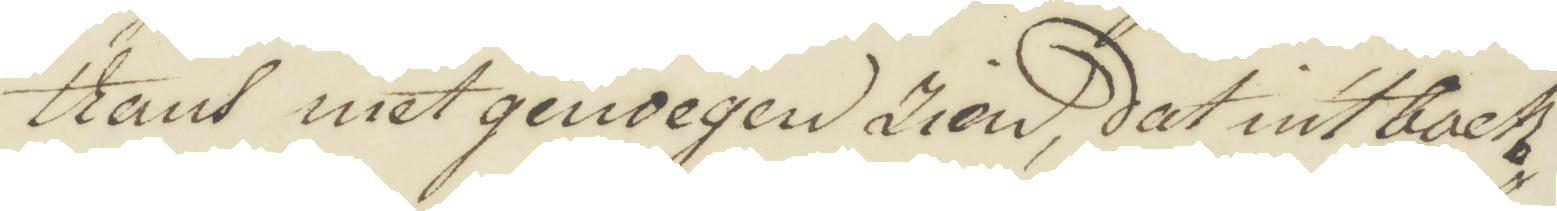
thans niet genoegen zien, dat in’t boek„
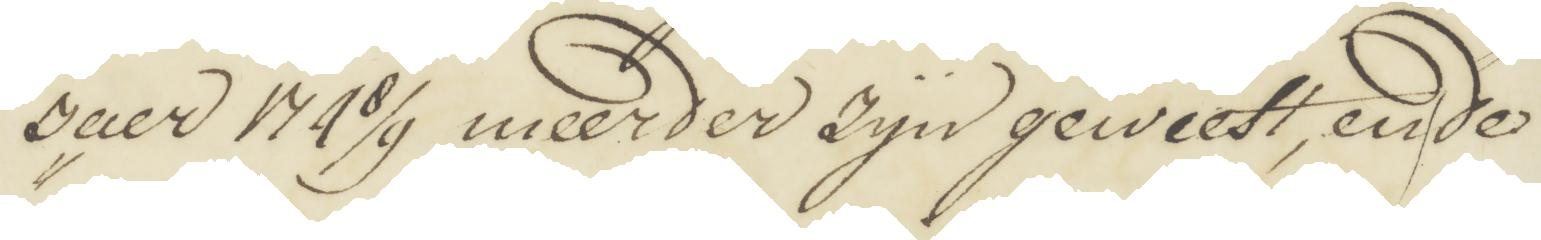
„jaer 1748/9 meerder zijn geweest, en de
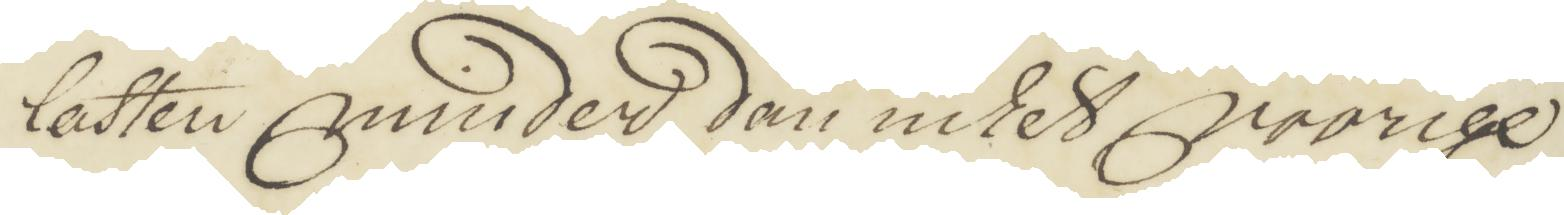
lasten minder dan in het voorige
